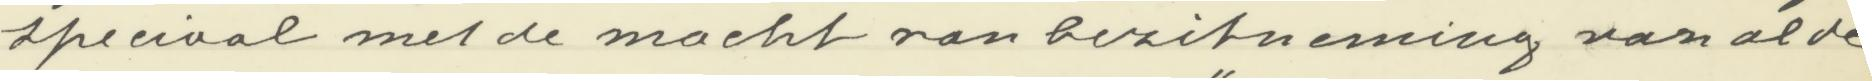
speciaal met de macht van bezitneming van al de
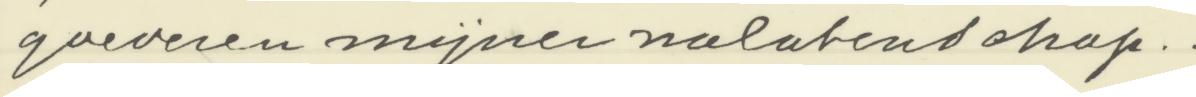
goederen mijner nalatenschap.
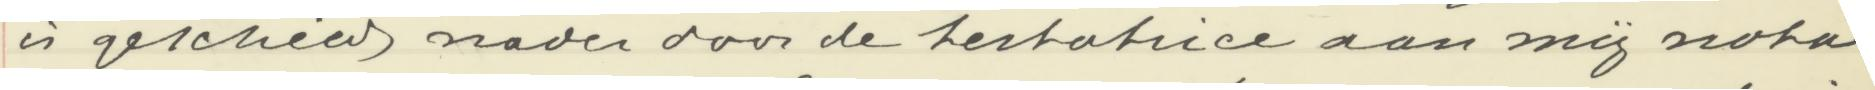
is geschied nader door de testatrice aan mij nota
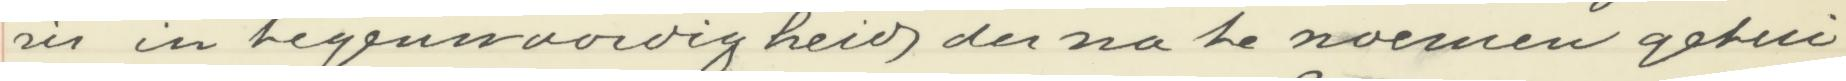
ris in tegenwoordigheid der na te noemen getui
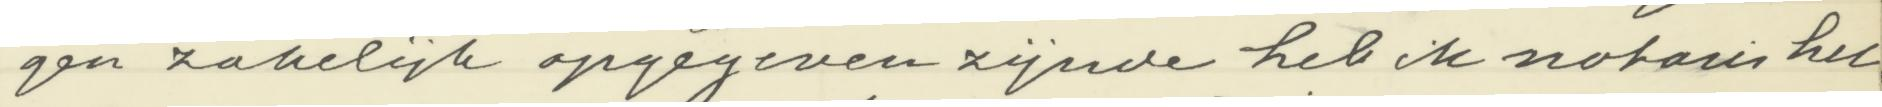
gen zakelijk opgegeven zijnde heb ik notaris het
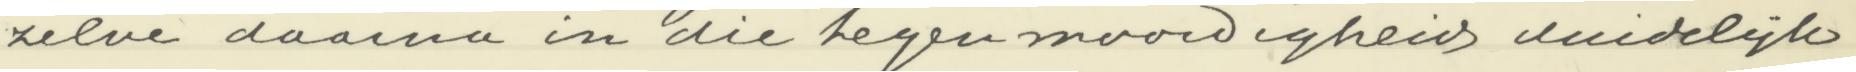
zelve daarna in die tegenwoordigheid duidelijk
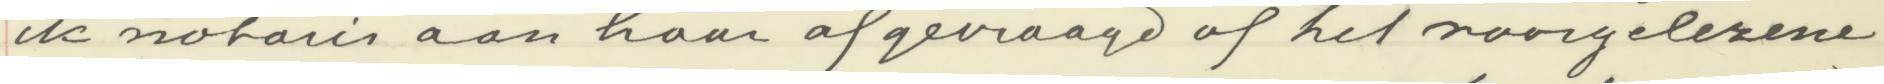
ik notaris aan haar afgevraagd of het voorgelezene
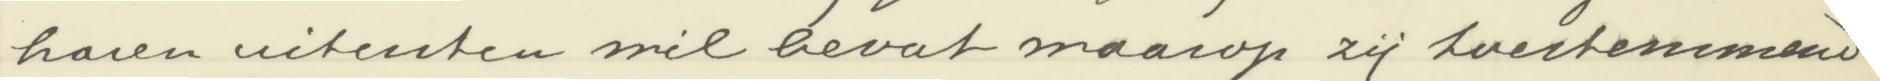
haren uitersten wil bevat waarop zij toestemmend
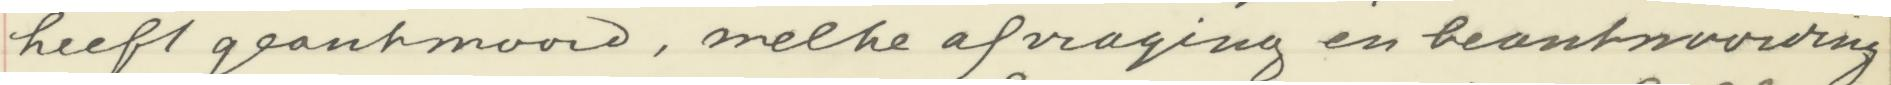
heeft geantwoord, welke afvraging en beantwoording
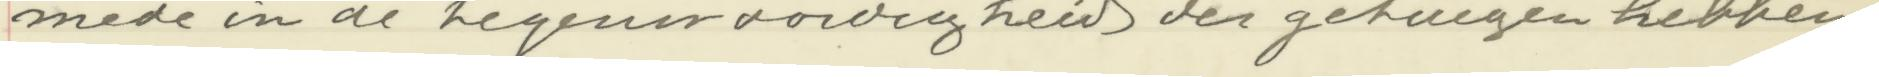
mede in de tegenwoordigheid der getuigen hebben
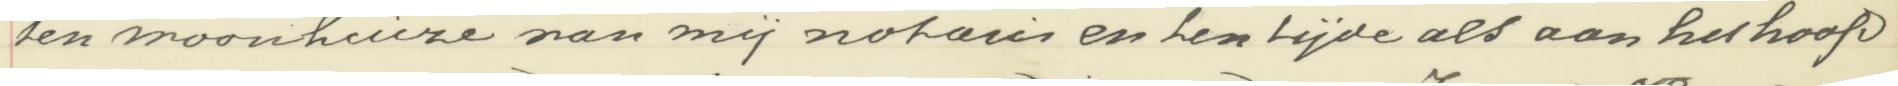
ten woonhuize van mij notaris en ten tijde als aan het hoofd
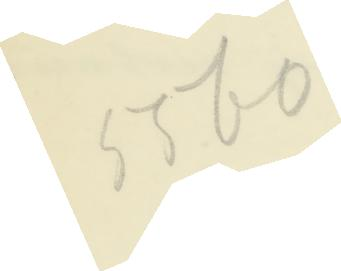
5560
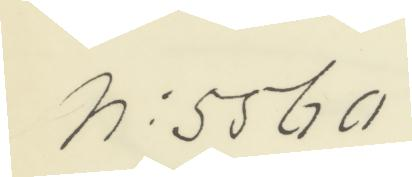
N: 5560
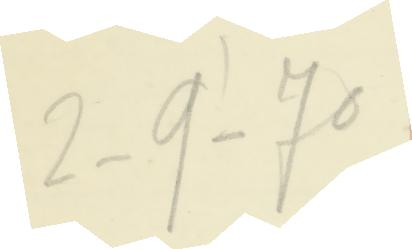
2-9'-70
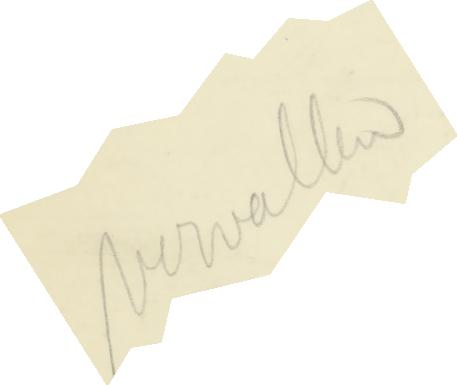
vervallen
